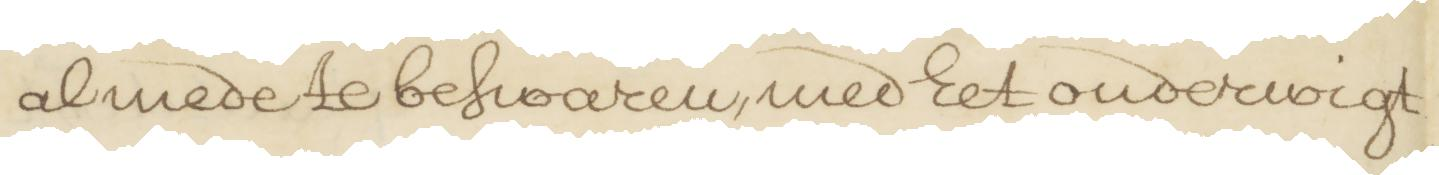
almede te beswaren, med het onderwigt
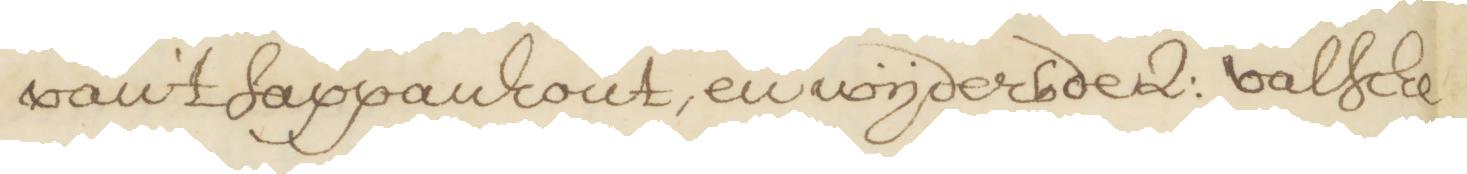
van ’t Sappanhout, en wijders de 2: valsche
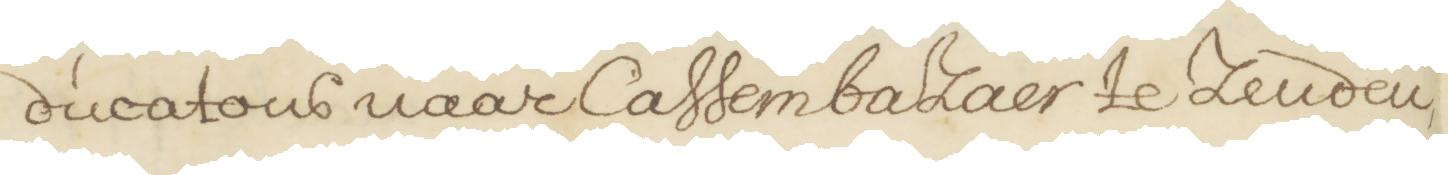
ducatons naar Cassembazaer te zenden
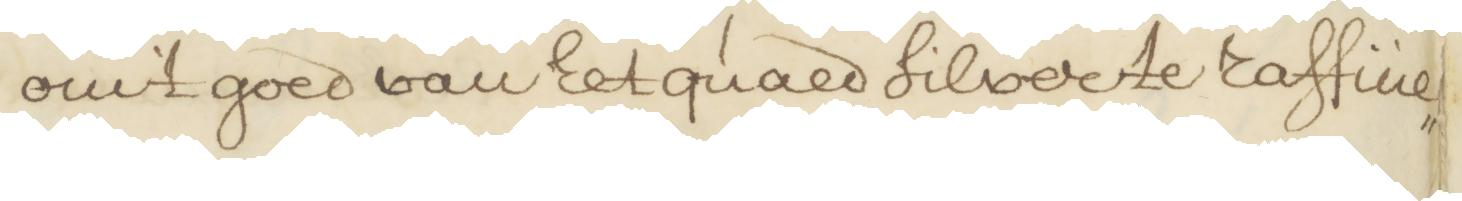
om ’t goed van het quaed silver te raffine„
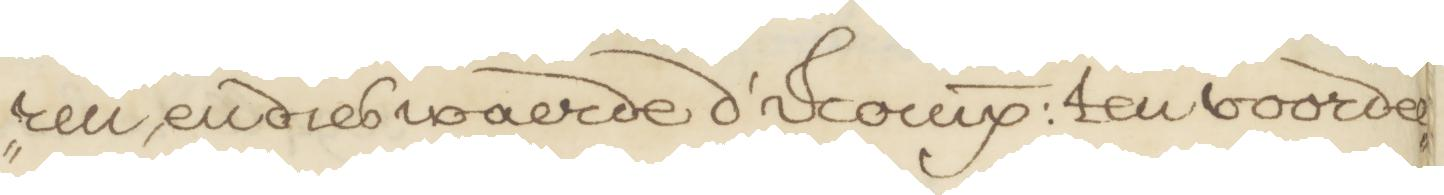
„ren, en dies waerde d’ Ecomp: ten voorde„
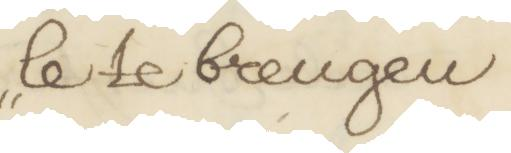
le te brengen
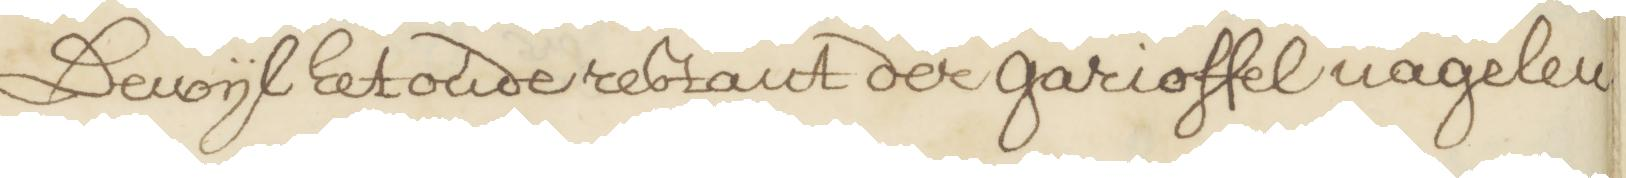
Dewijl het oude restant der garioffel nagelen
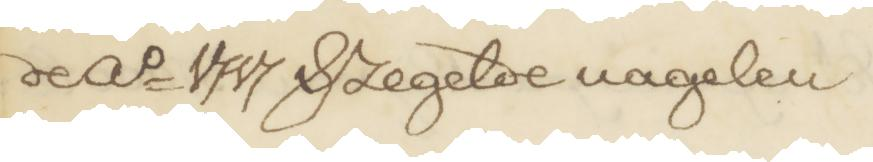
de A=o 1717 verzegelde nagelen
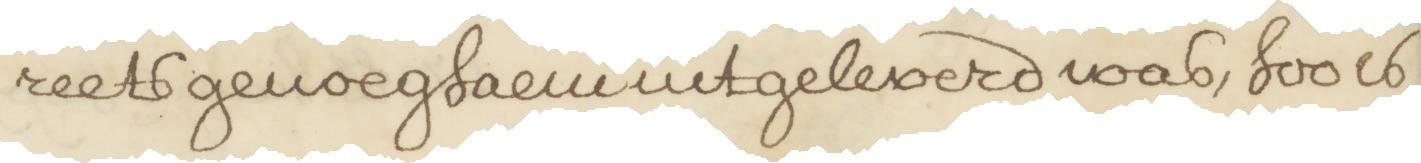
reets genoegsaem uitgeleverd was, soo is
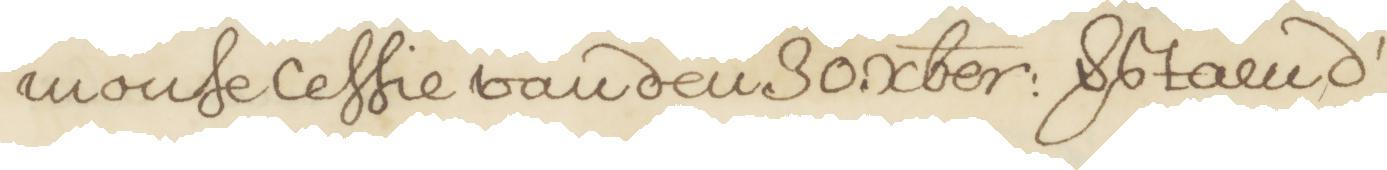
in onse cessie van den 30. xber: verstaen d'
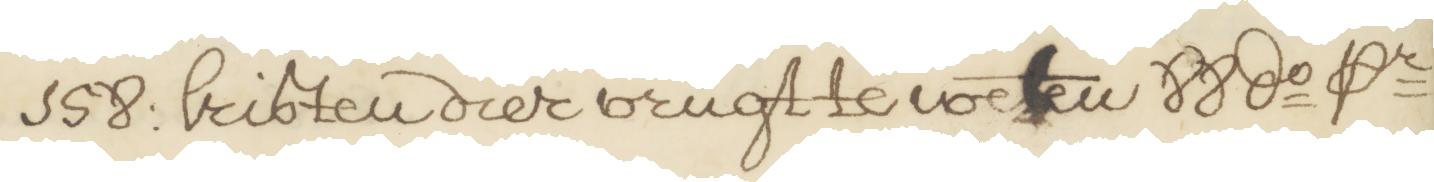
158: kisten dier vrugt te weten 88 d=o P=r
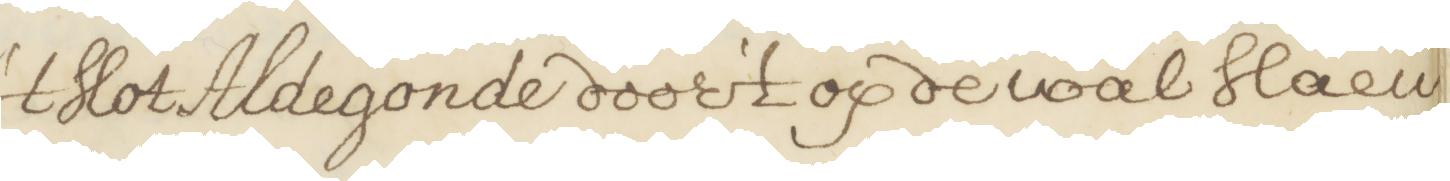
’t slot Aldegonde door ’t op de wal slaen
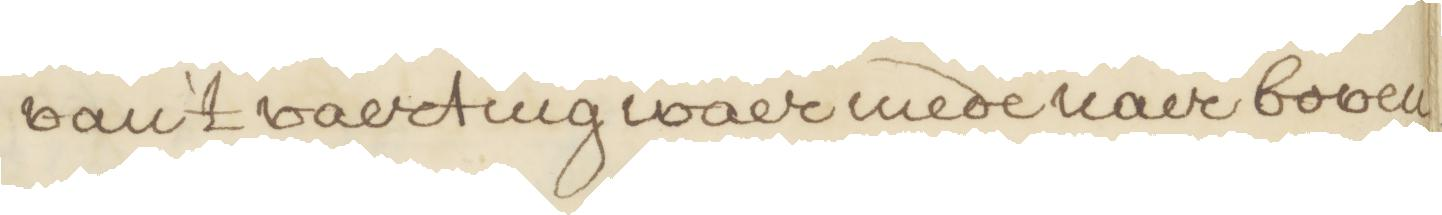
van ’t vaertuig waer mede naer boven
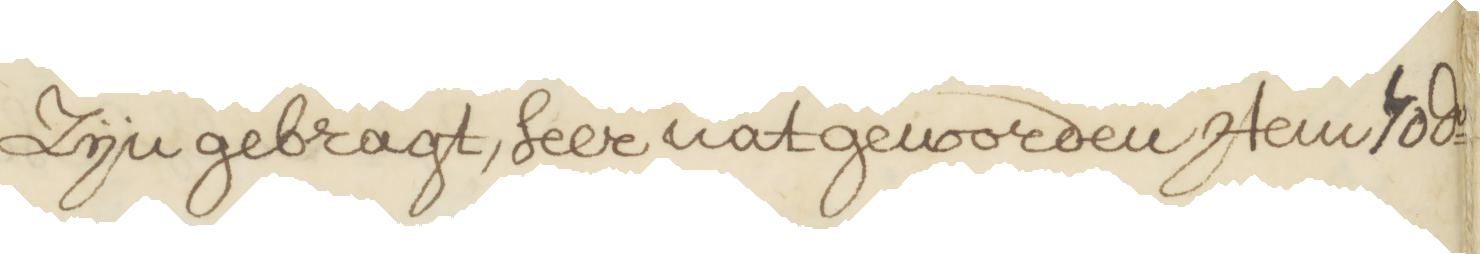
Zijn gebragt, seer nat geworden item 40d=o
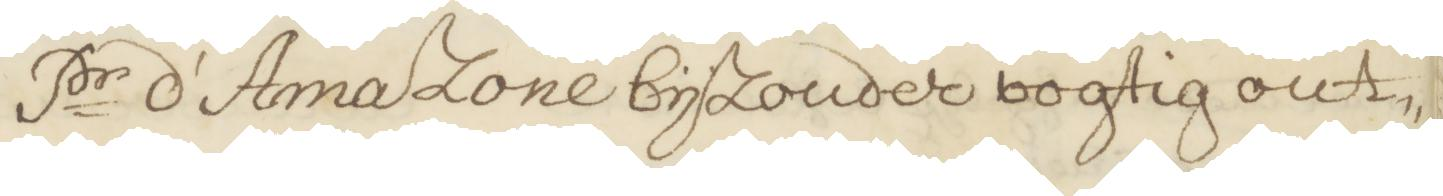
P=r d’Amazone bijzonder vogtig ont„
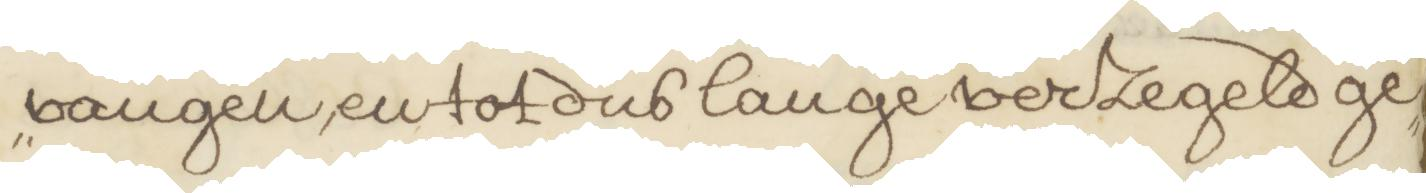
„vangen, en tot dus lange verzegeld ge„
